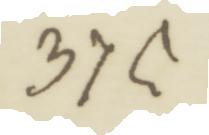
375
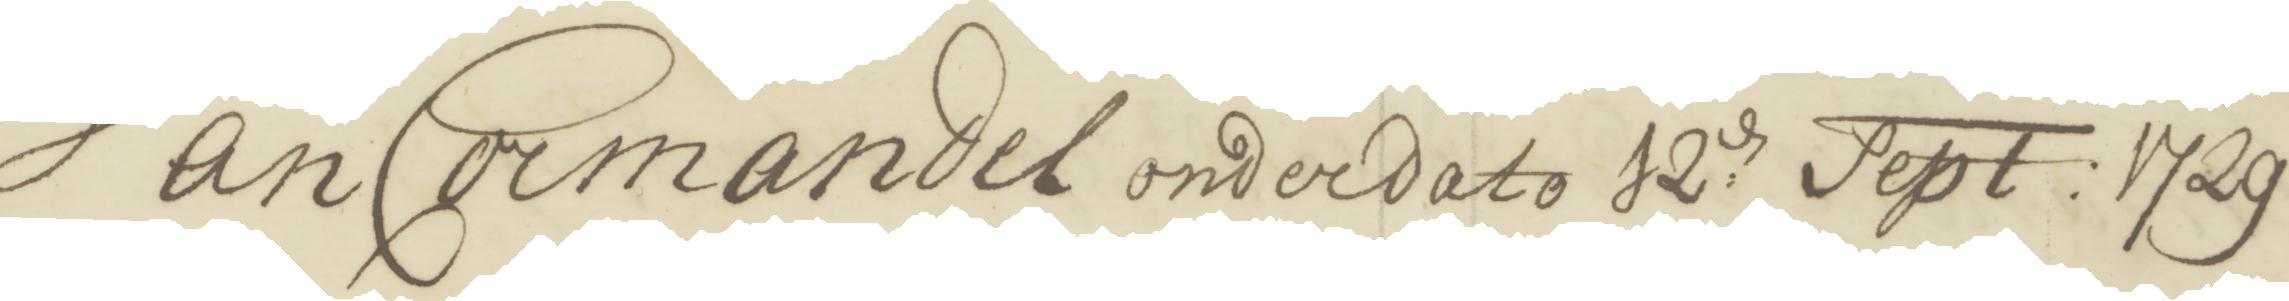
Van Cormandel onder dato 12:en Sept: 1729
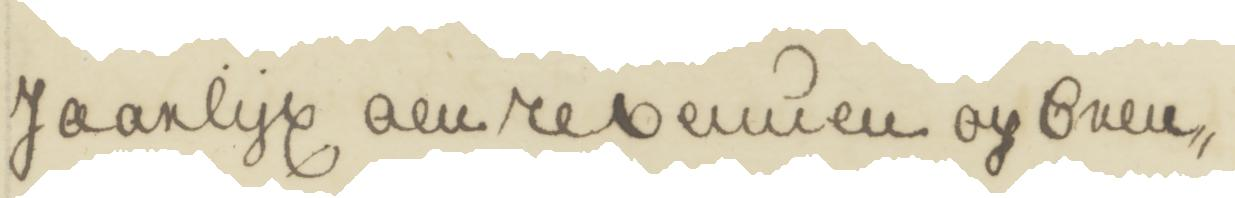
Jaarlijx aen revenuen op bren„
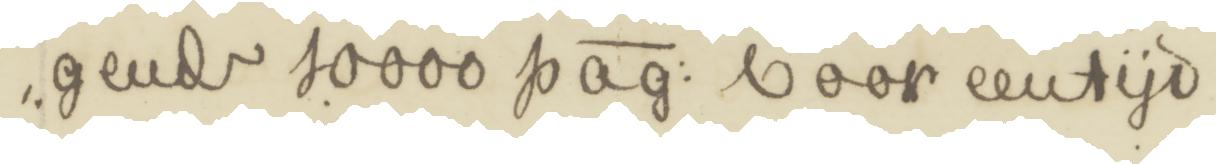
„gende 10000 pag: voor een tijd
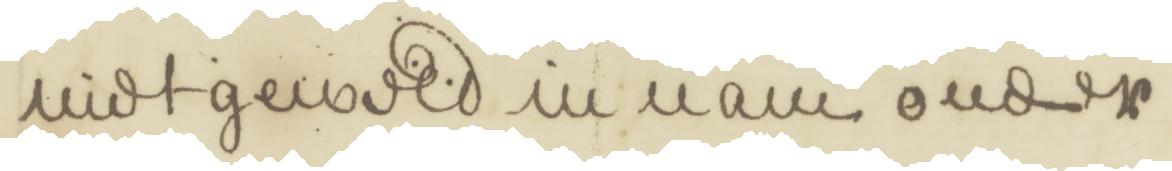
met geweld in nam onder
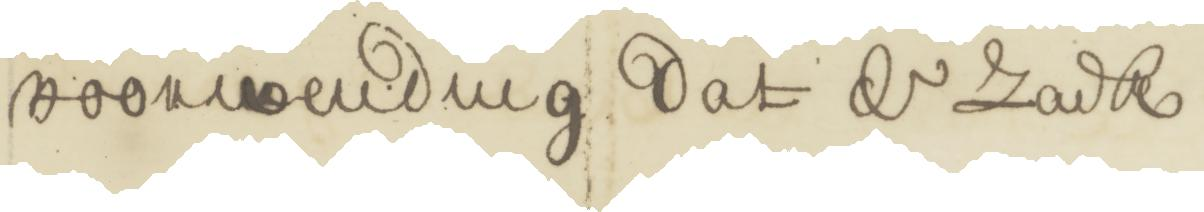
voorwending dat de zaek
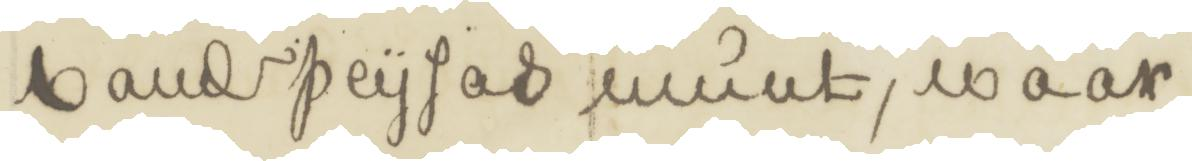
van de peijsas munt, waar
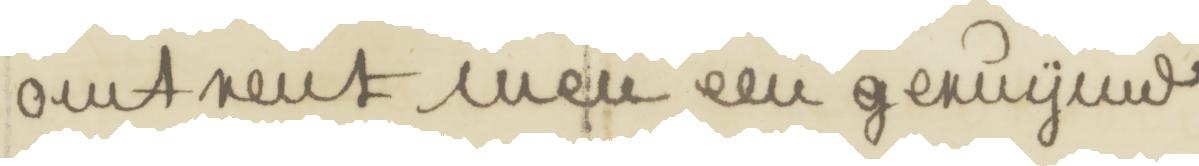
omtrent men een geruijme
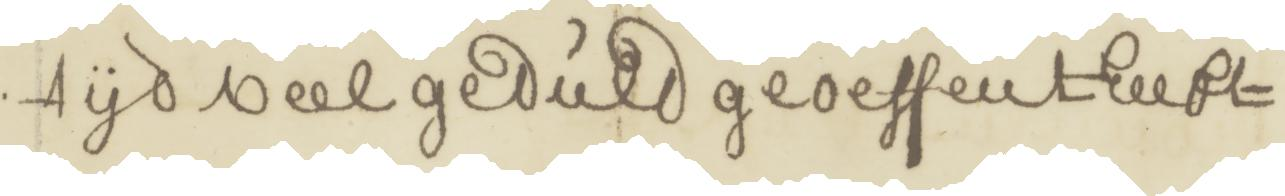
tijd veel geduld geoeffent heeft
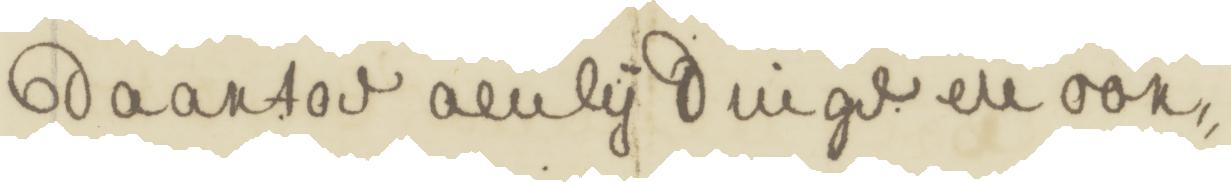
daartoe aenlijdinge en oor„
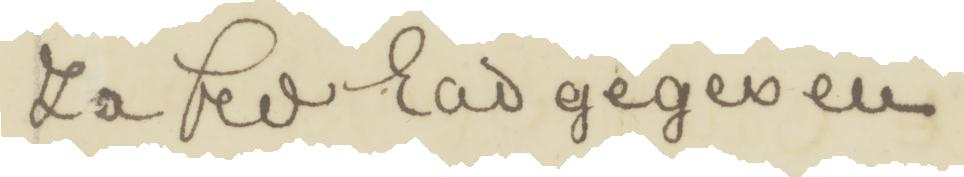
zake had gegeven
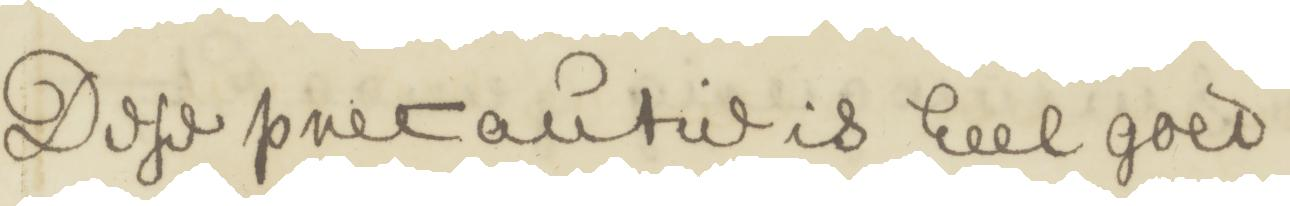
Dese precautie is heel goed
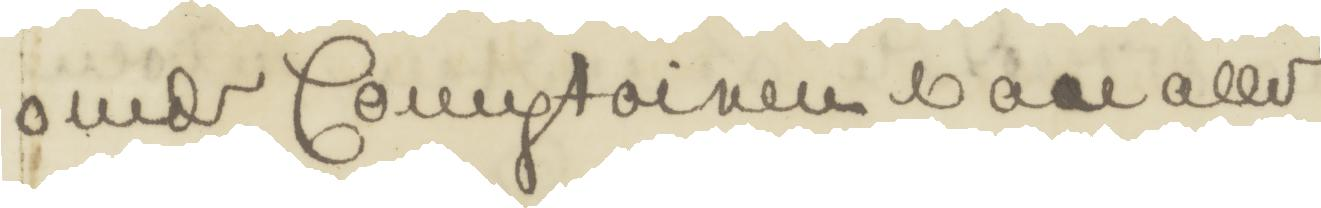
om de Comptoiren van alle
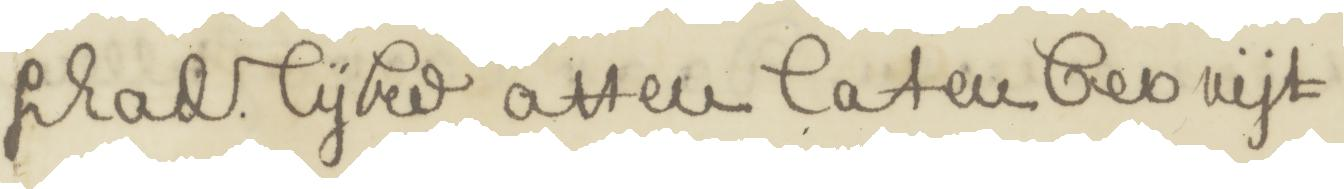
schadelijke atten laten bevrijt
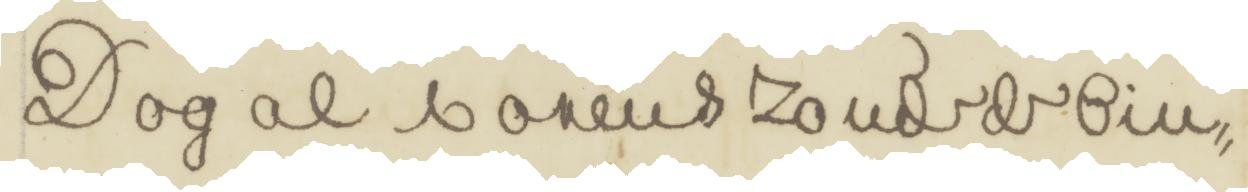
Dog al vorens zoude de bin„
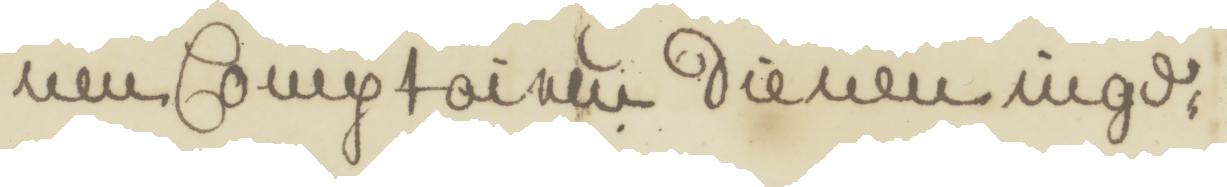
nen Comptoiren dienen inge„
